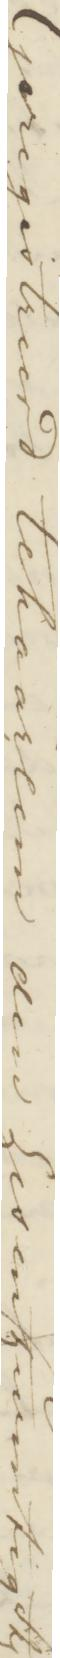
Geregistreerd te haarlem den zesentwintigsten
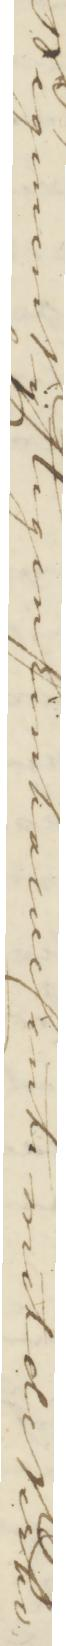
Negenenvijftig en Een halve Cents met de verho„
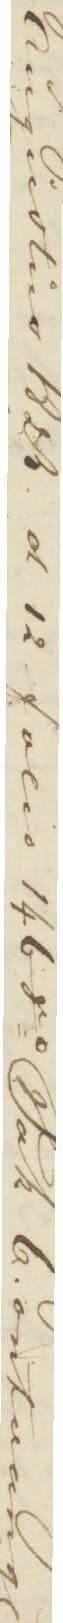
augustus 1823. a 12 folio 146 r=o Vak 6. ontvangen
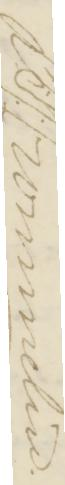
d.F. Crommelin
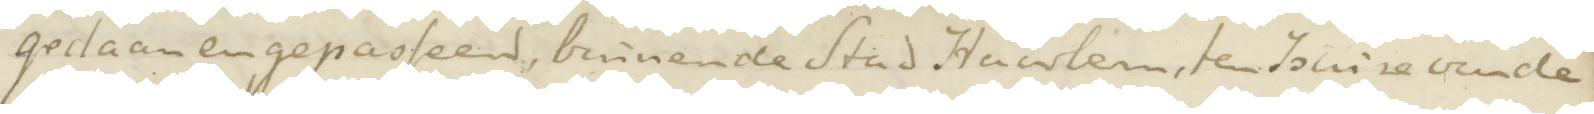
gedaan en gepasseerd, binnen de Stad Haarlem, ten huize van de
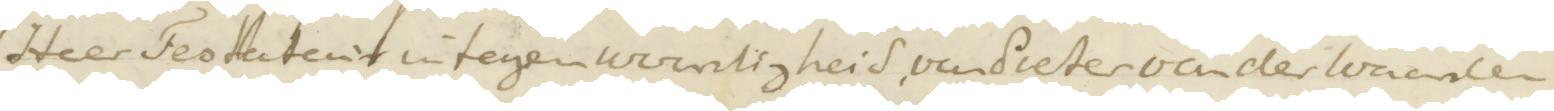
Heer Testateur in tegenwoordigheid, van Pieter van der Waarden
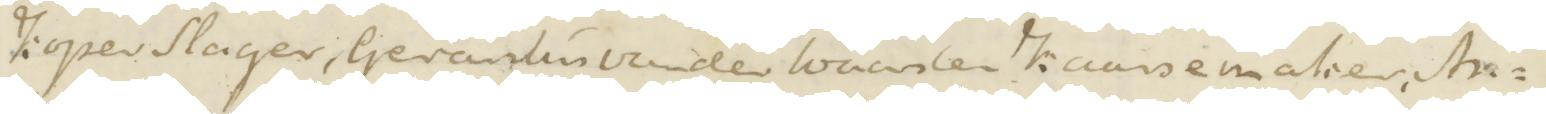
Koper slager, Gerardus van der Waarden Kaarsemaker, An=
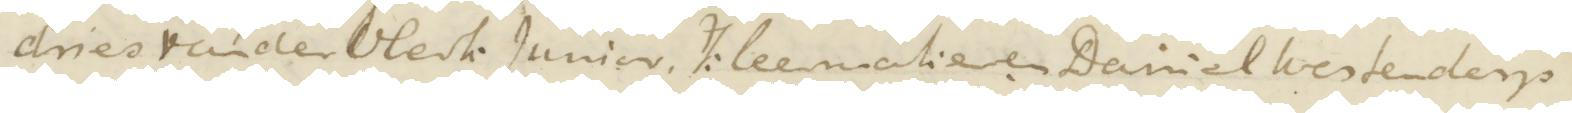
dries van der Vlerk Junior, Kleermaker en Daniel Westendorp
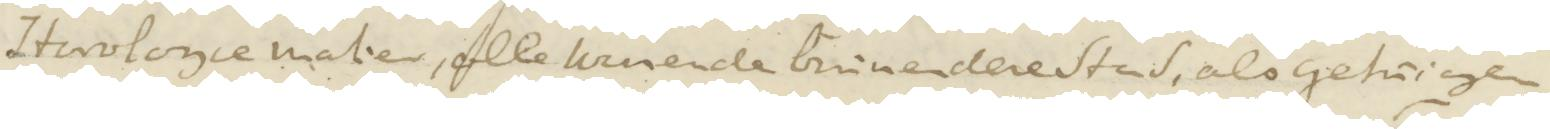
Horologie maker, alle wonende binnen deze stad, als getuigen
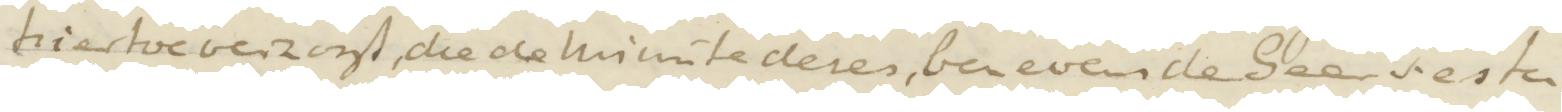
hiertoeverzogt, die de minute dezes, benevens de heer Testa
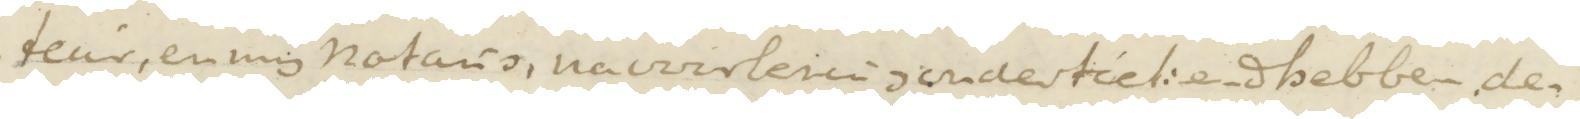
. teur, en mij Notaris, na voorlezing ondertekend hebben de„
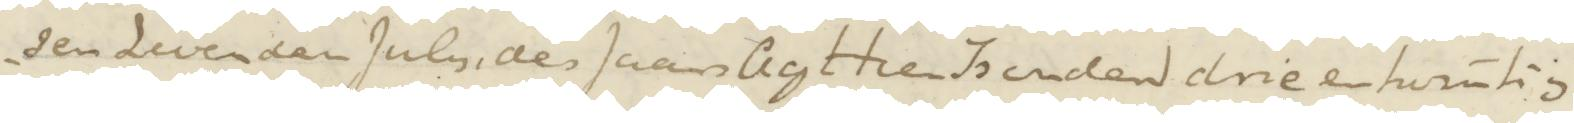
_sen Zevenden July, des Jaars Agttien honderd drie en twintig
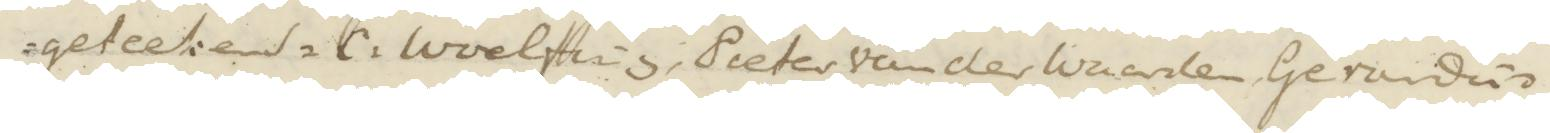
=geteekend= C: Woelfing, Pieter van der Waarden, Gerardus
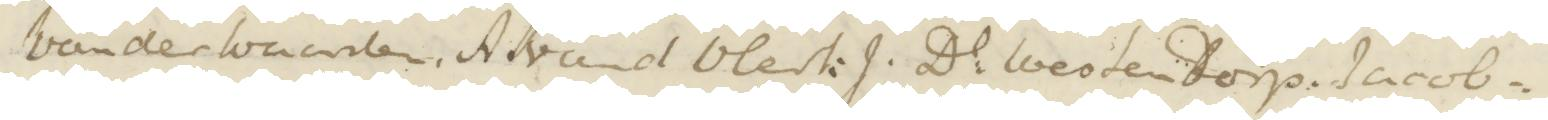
van der Waarden, A. vand Vlerk J. D:l Westendorp. Jacob=
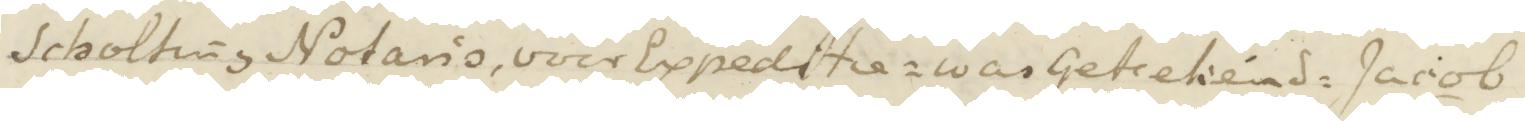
scholting Notaris, voor Expeditie = was Geteekend= Jacob
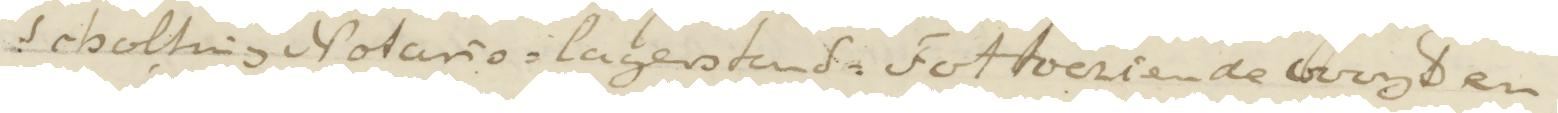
scholting Notaris =lagerstont= Tot toeziende voogd en
